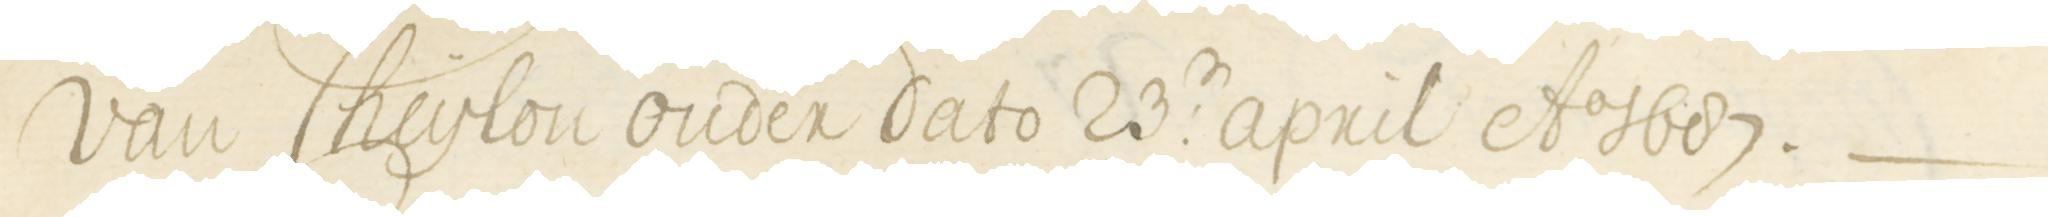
Van Cheijlon onder dato 23:' april Ao 1687. —
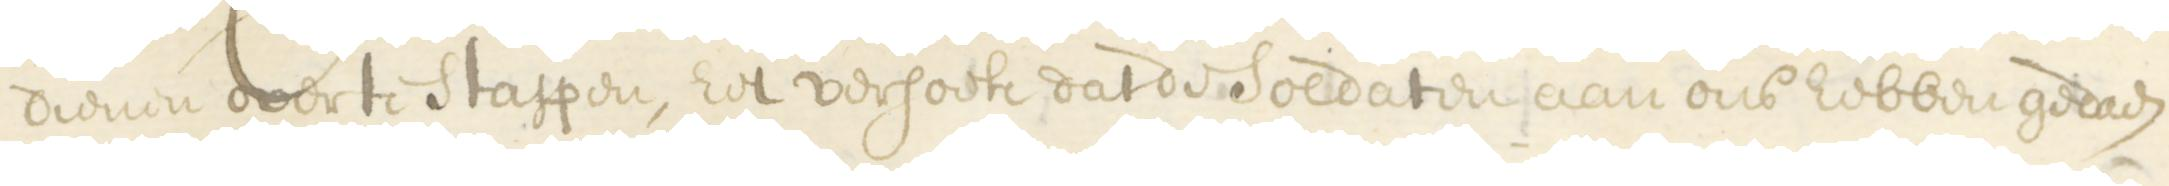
dienen over te stappen, het versoek dat de soldaten aan ons hebben gedaen
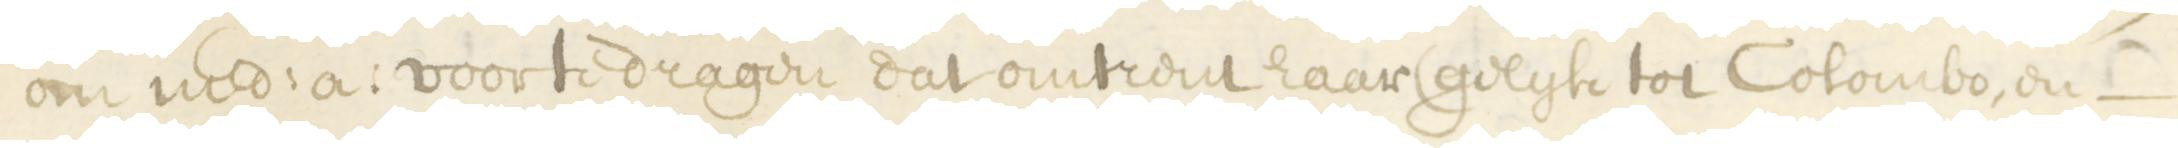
om uEd: a: voortedragen dat omtrent haar gelijk tot Colombo, en —
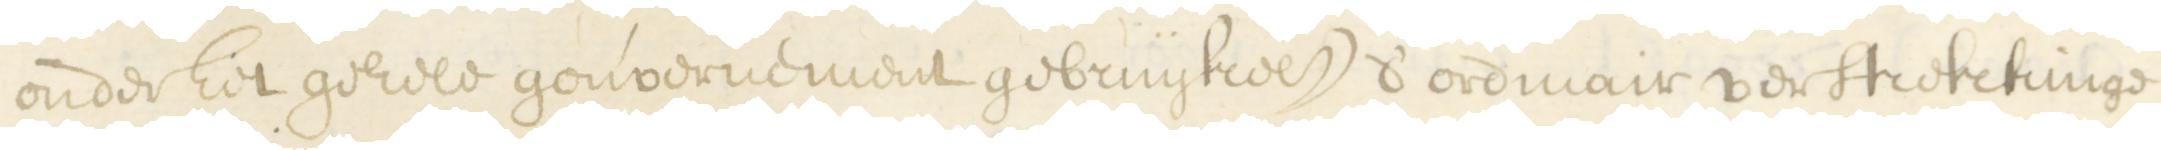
onder het gehele gouvernement gebruijkelijk d' ordinair verstrekkinge
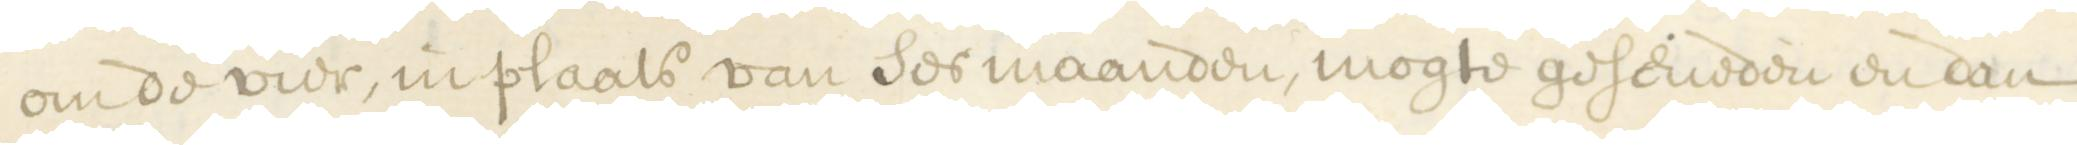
om de vier, in plaats van ses maanden, mogte geschieden en dan
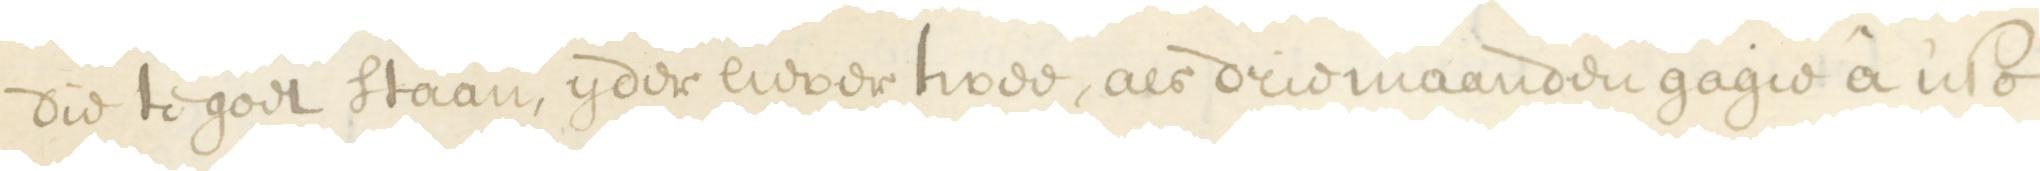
die te goet staan, ijder liever twee, als drie maanden gagie â uso
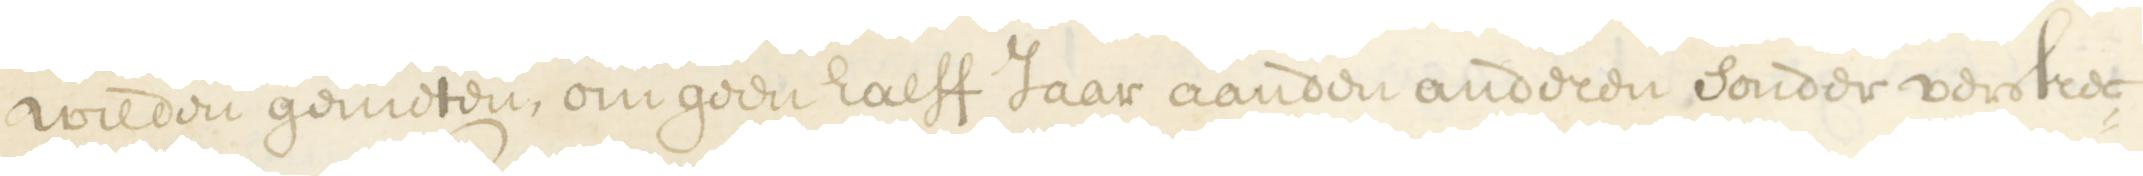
wilden genieten, om geen halff Jaar aanden anderen sonder verstrec„
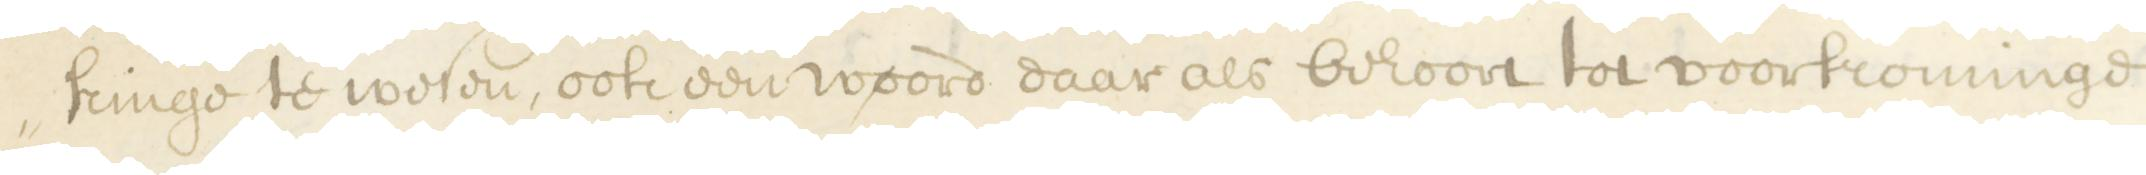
„kinge te wesen, ook een woord daar als behoort tot voorkominge
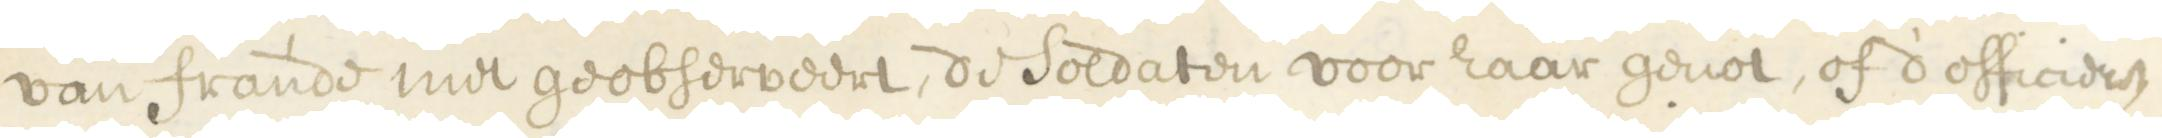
van fraude niet geobserveert, de soldaten voor haar genot, of d’ officieren
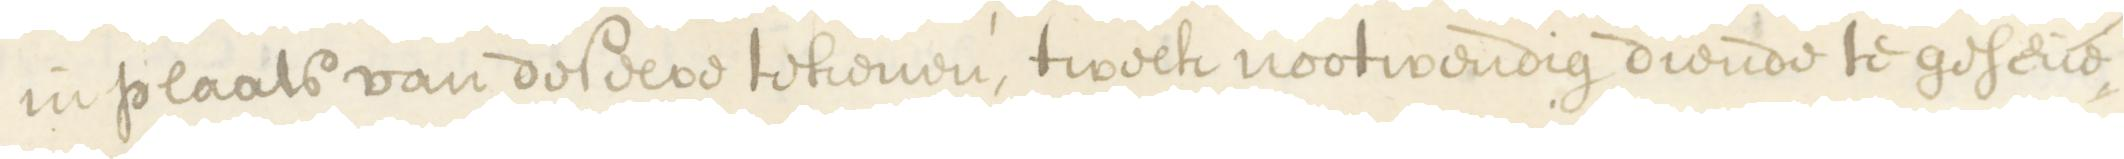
in plaats van deselve tekenen, twelk nootwendig diende te geschie„
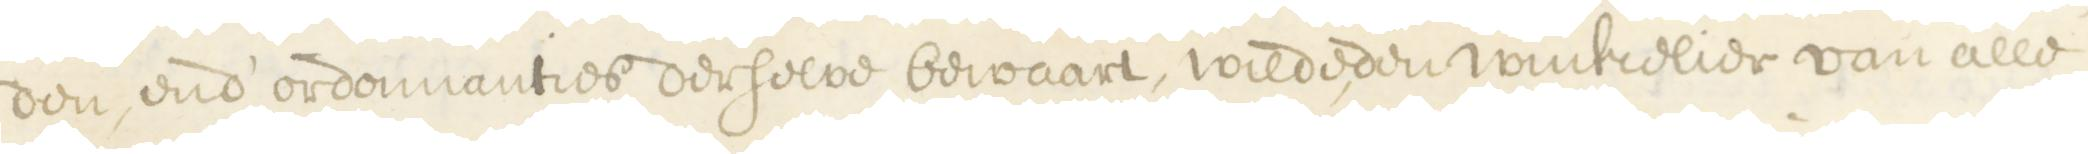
den, en d’ ordonnanties derselve bewaart, wilde, den winkelier van alle
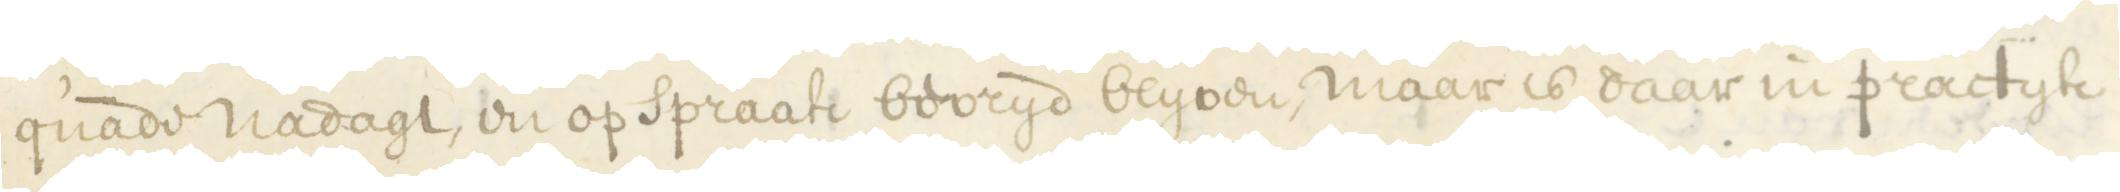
quade nadagt, en op spraak bevrijd blijven, maar is daar in practijk
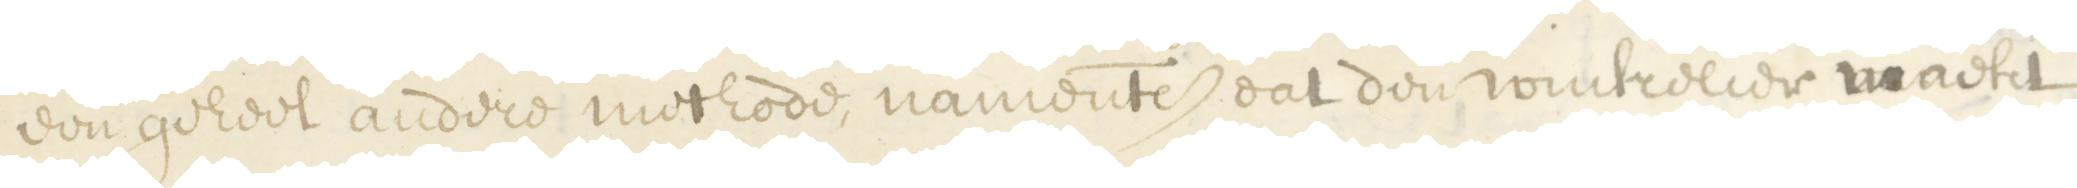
een geheel andere methode, namentlijk dat den winkelier maekt
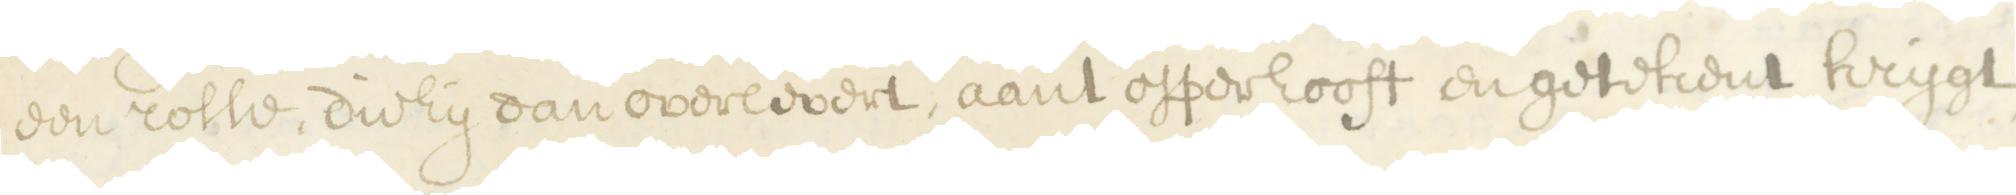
een rolle, diehij dan overlevert, aan't opperhooft en getekent krijgt
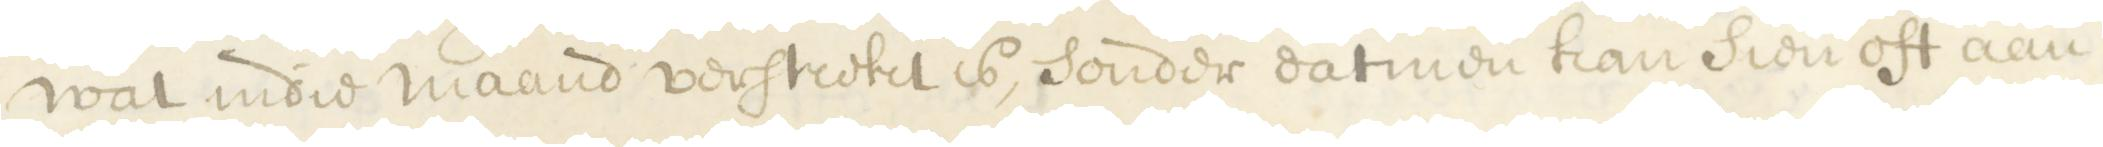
wat indie maand verstrekt is, sonder datmen kan sien oft aan
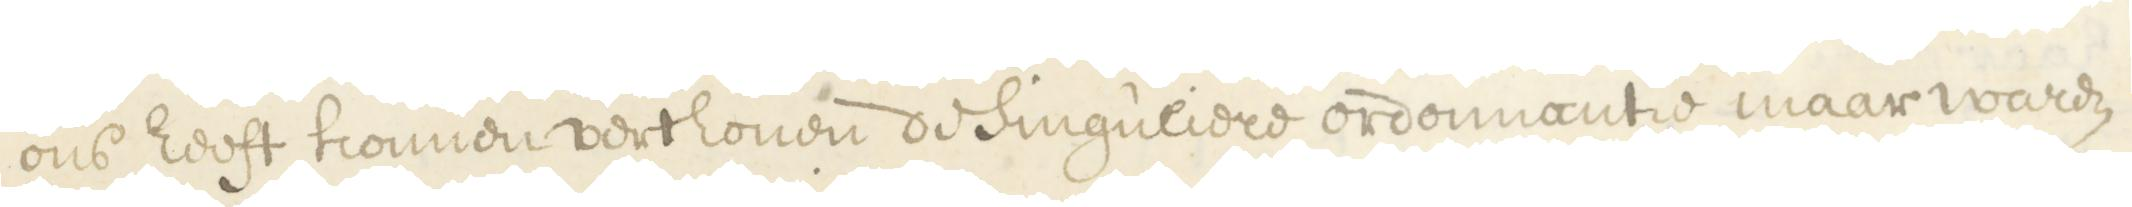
ons heeft konnen verthonen desinguliere ordonnantie maar waren
